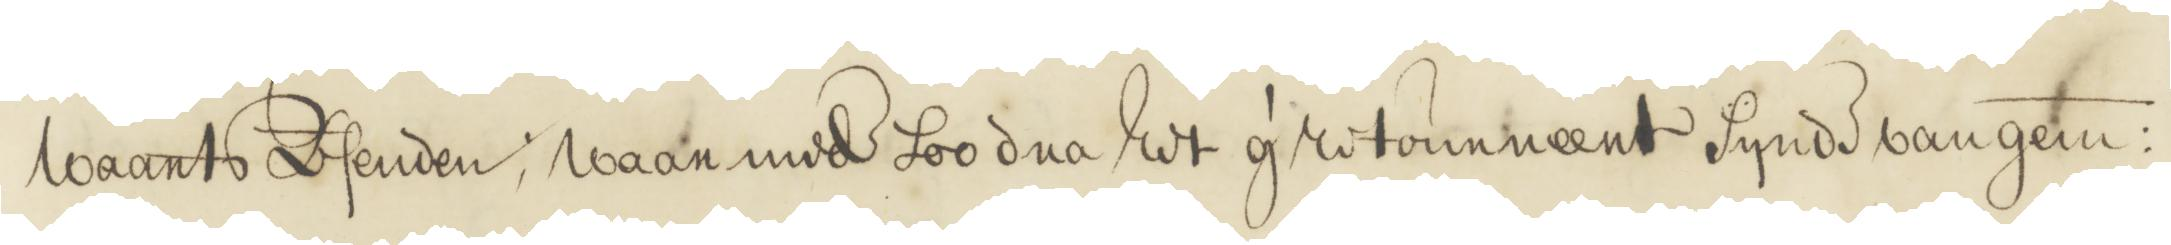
waarts tesenden; waar mede soo dra het g’retourneert sijnde van gem:
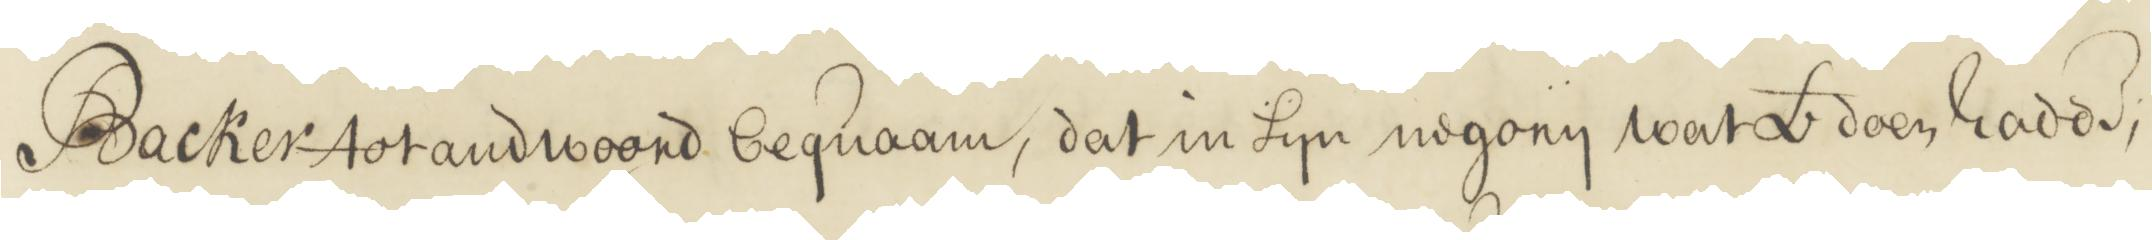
Backer tot andwoord bequaam, dat in sijn negorij wat te doen hadde,
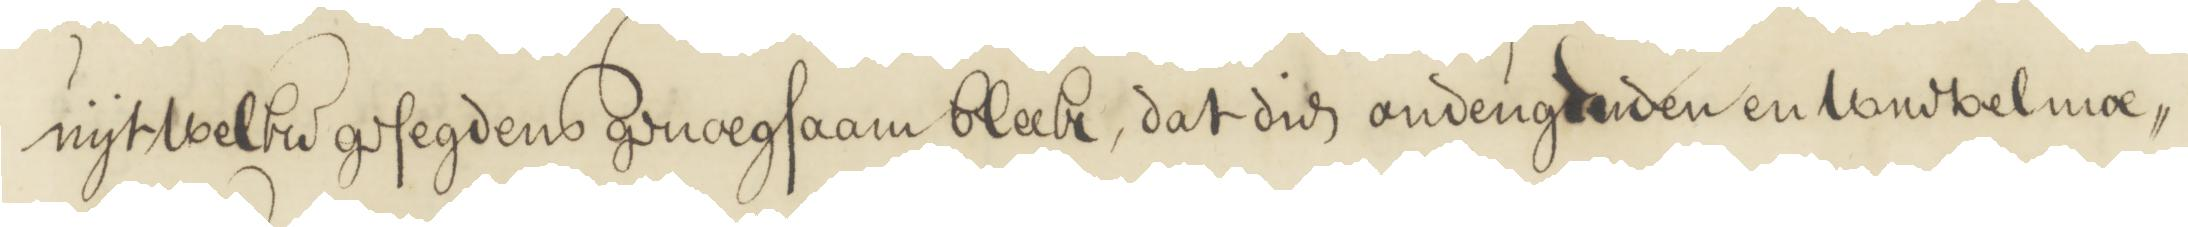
uijt welke gesegdens genoegsaam bleek, dat dien ondeugenden en wrevelmoe„
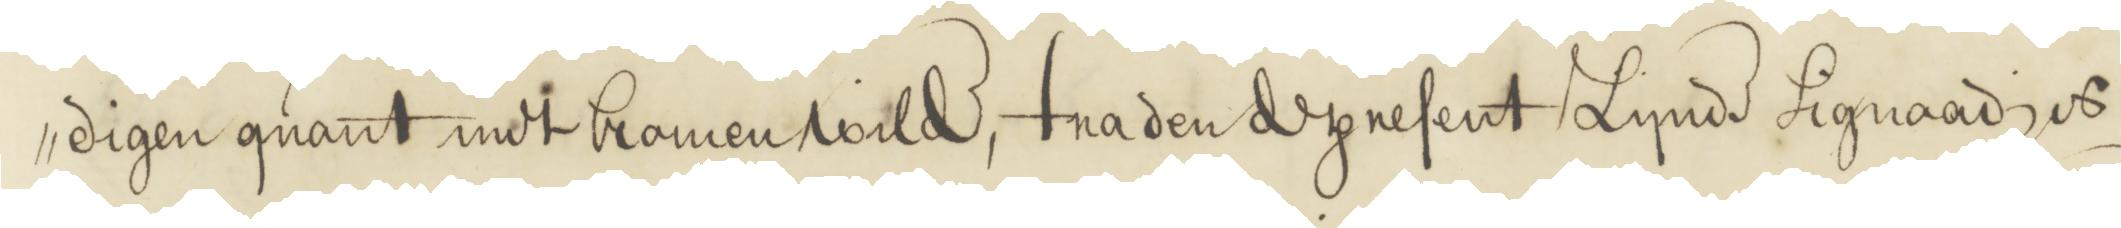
„digen quant niet komen wilde, traden depresent zijnde signaadjes
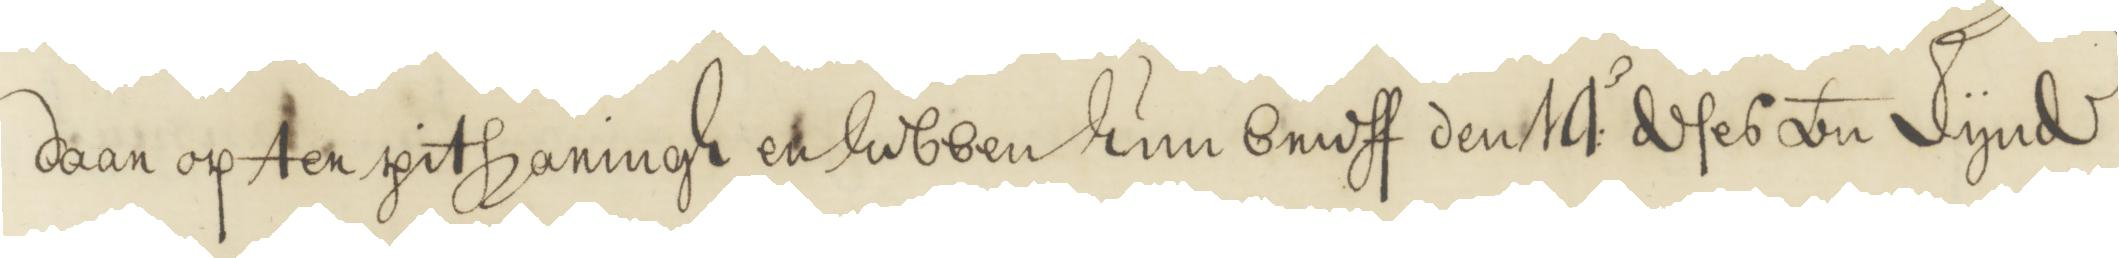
daar op ter pitsjaringh en hebben hun brieff den 14.' deses ten Eijnde
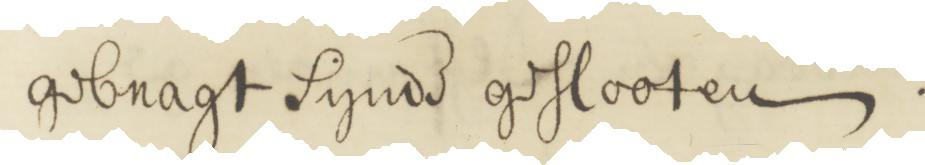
gebragt sijnde geslooten.
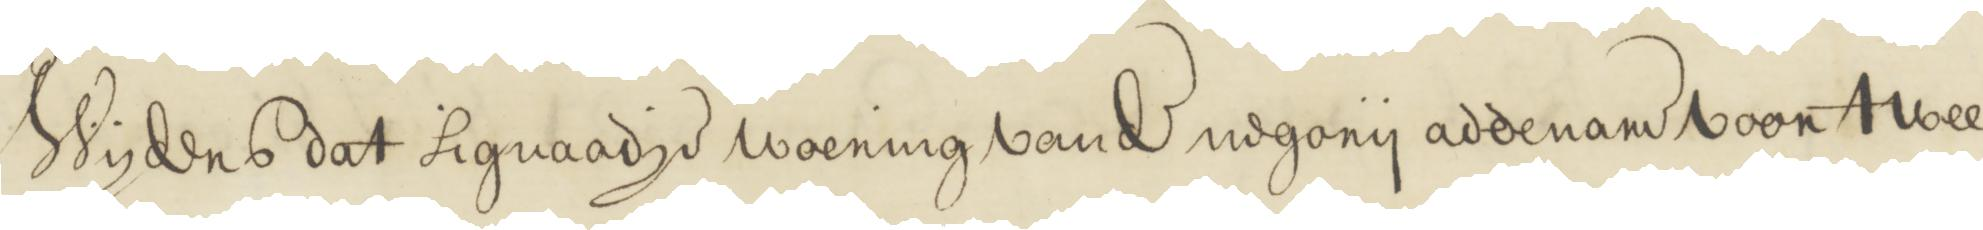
Wijders dat siqnaadje woening van de negorij addenare voor twee
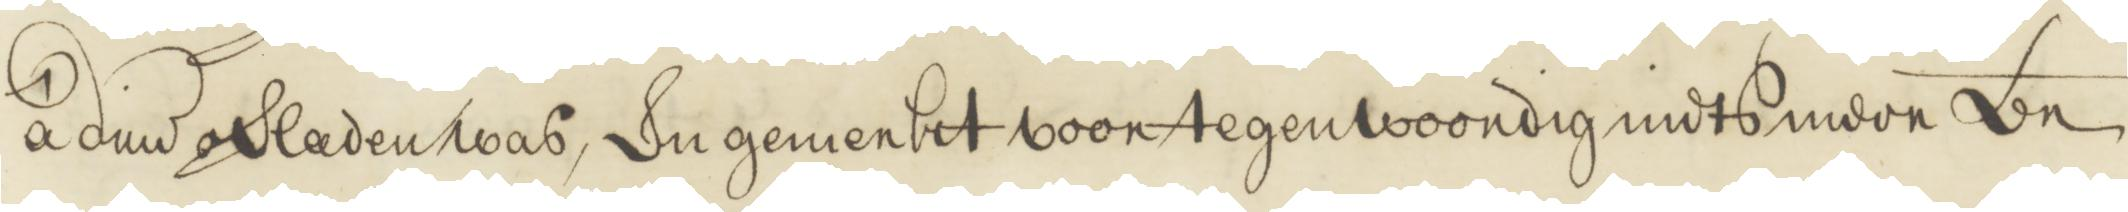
â drie overleden was, En gemerkt voor tegenwoordig niets meer ter
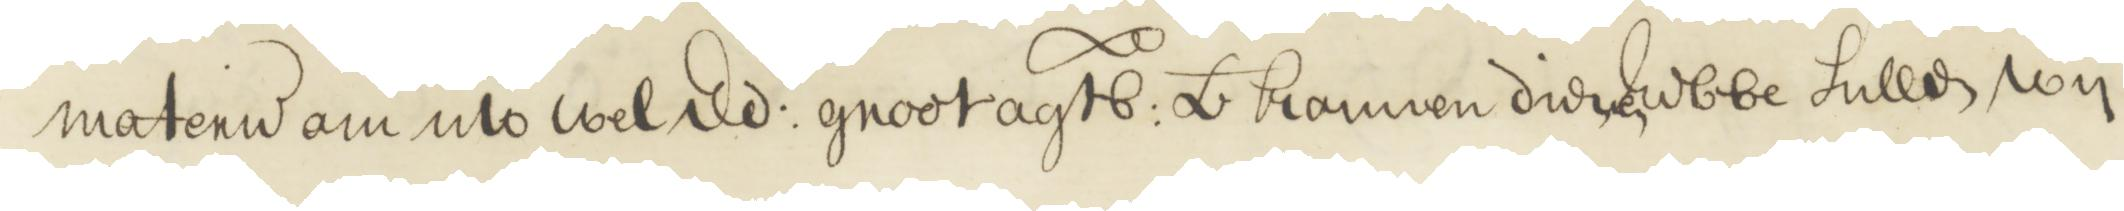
materie om uw wel Ed: groot agtb: te konnen dienen hebbe sullen wij
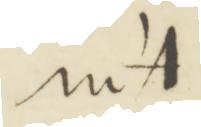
in ’t
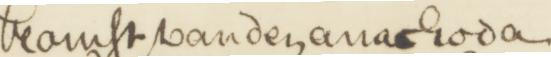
komst van den anachoda
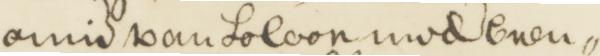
omie van soloor mede bren„
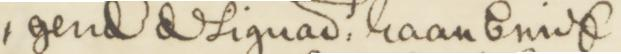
„gende de signad:s haar brief
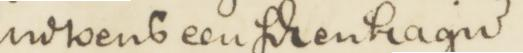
nevens een schenkagie
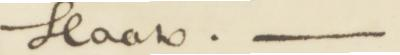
slaav. —
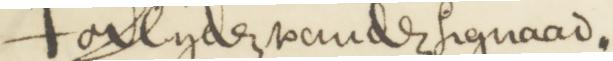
’t overlijden van den signaad„
